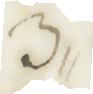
3„
